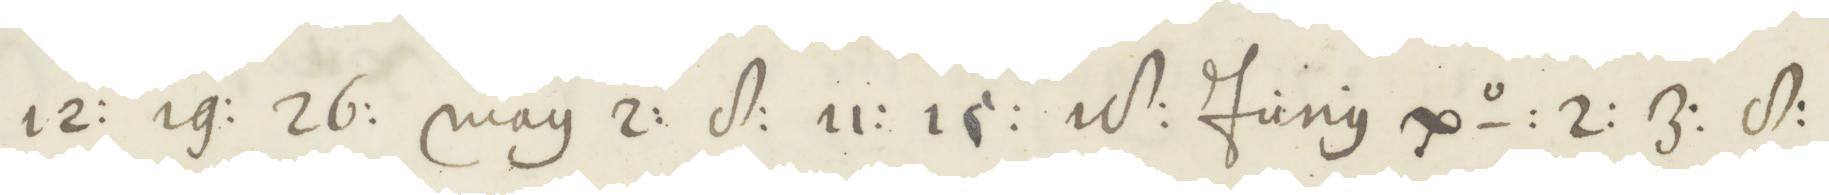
12: 19: 26: may 2: 8: 11: 15: 18: Junij p-o: 2: 3: 8:
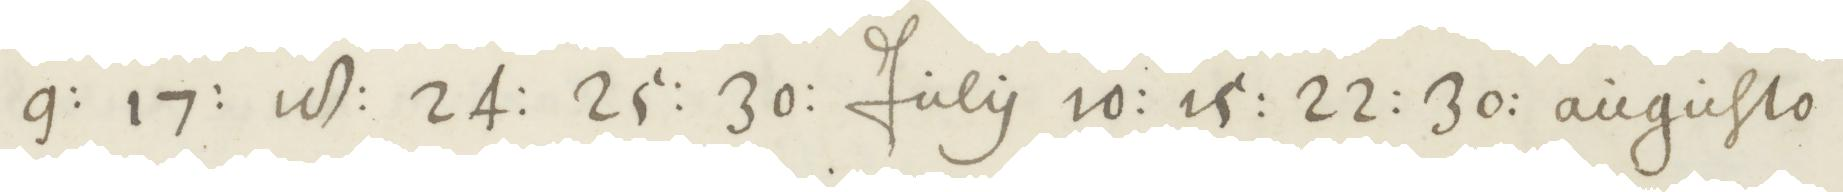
9: 17: 18: 24: 25: 30: Julij 10: 15: 22: 30: augusto
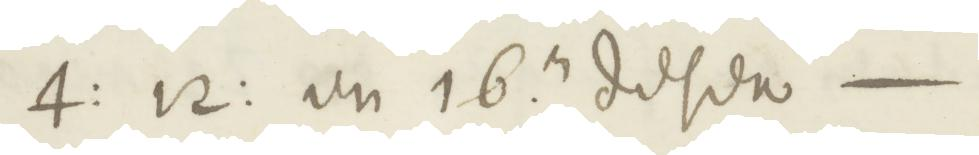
4: 12: en 16.e deser —
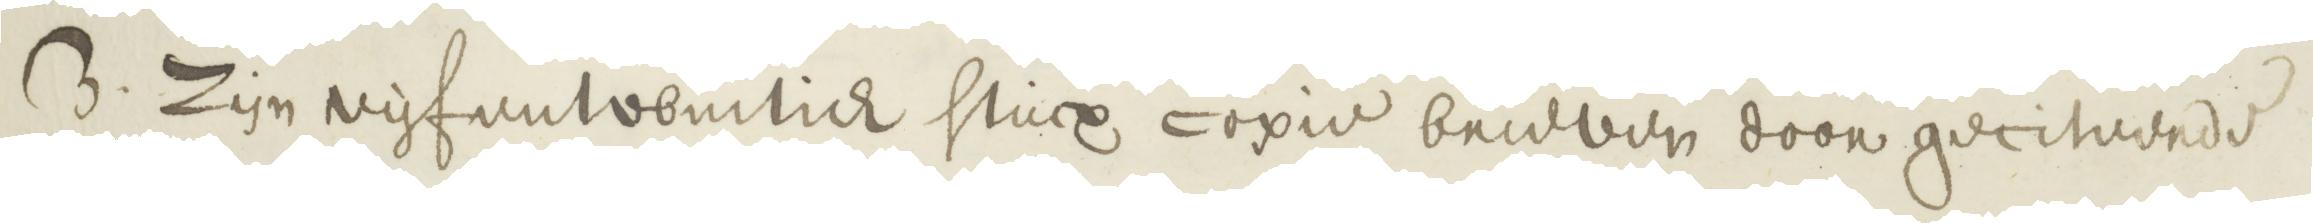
3. Zijn vijf en twintich stucx copie brieven door geciteerde
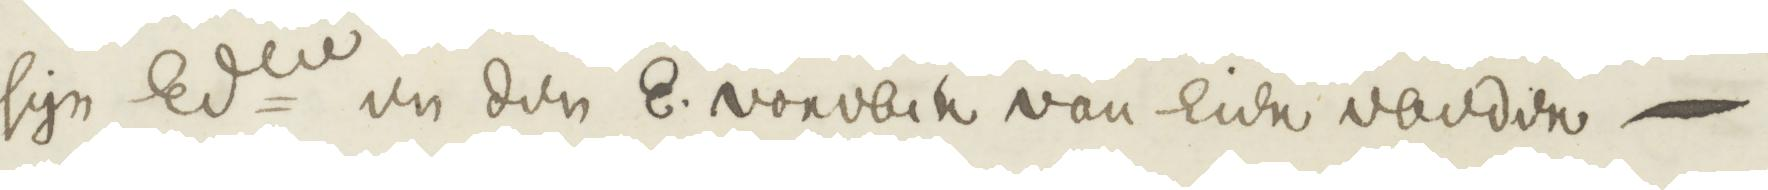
sijn Ed=le en den E. vorwik van hier weder -
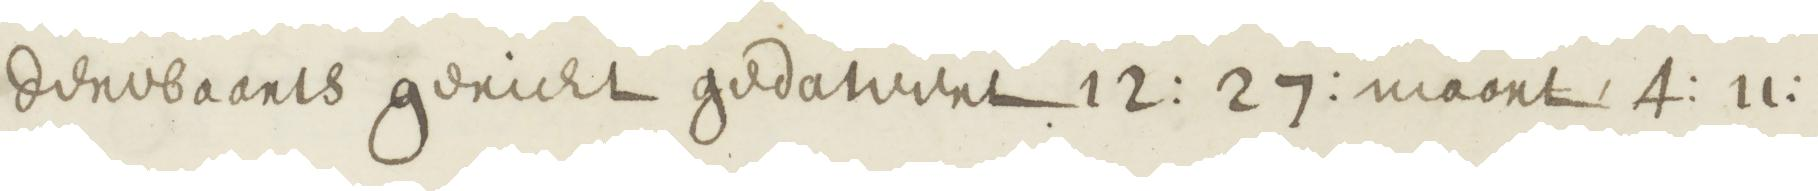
derwaarts gericht gedateert 12: 27: maart 4: 11:
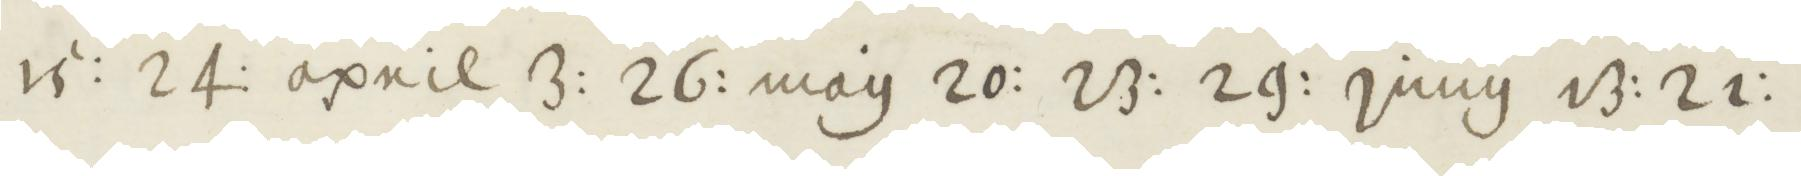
15: 24: april 3: 26: maij 20: 23: 29: junij 13: 21:
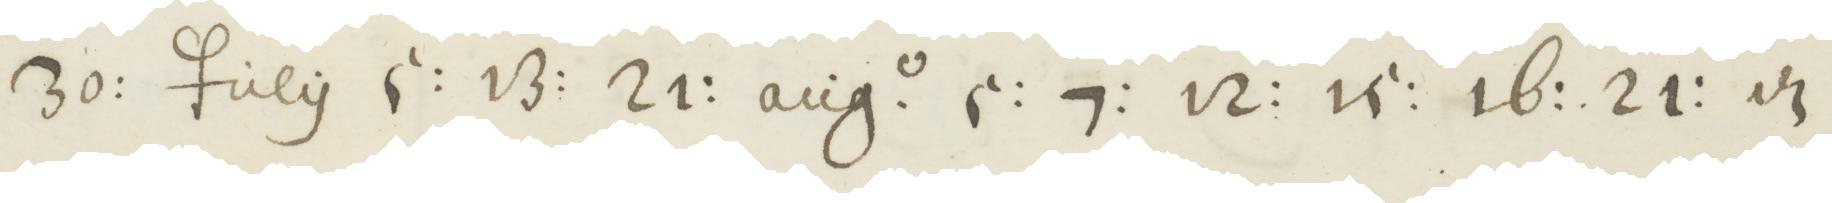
30: Julij 5: 13: 21: aug.o 5: 7: 12: 15: 16: 21: en
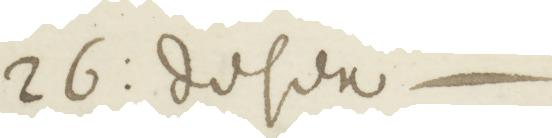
26: deser -
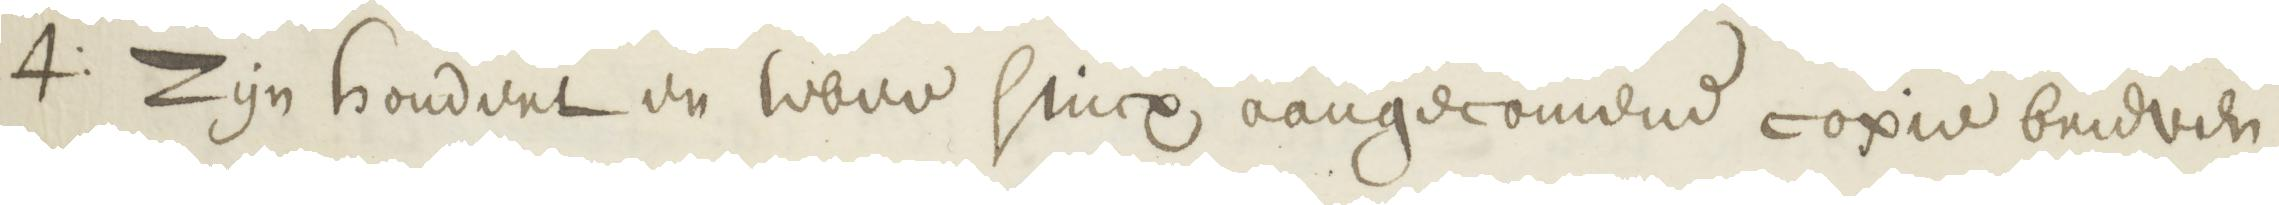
4: Zijn hondert en twee stucx aangecomene copie brieven
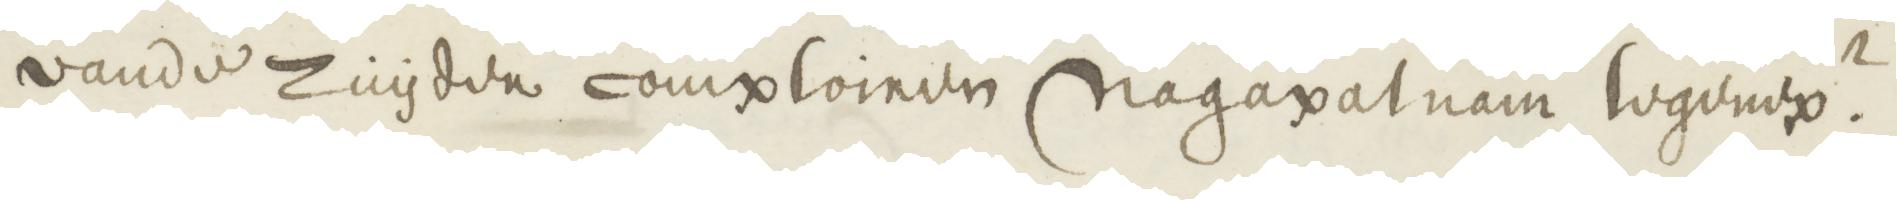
van de Zuijder comptoiren nagapatnam tegenex .t
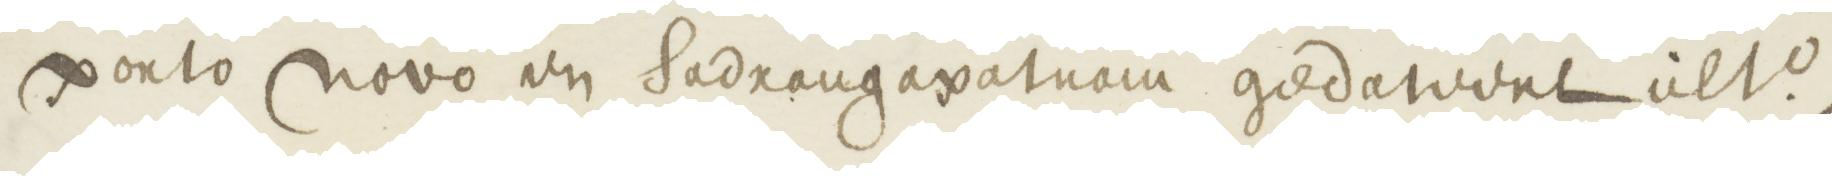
porto novo en Sadrangapatnam gedateert ult.o
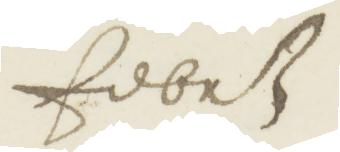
febr
